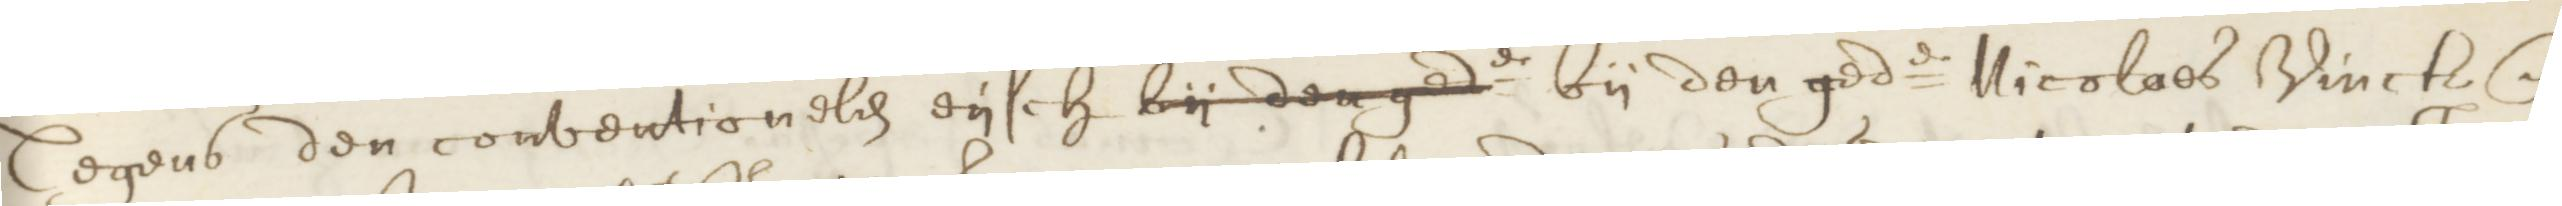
Tegens den conventionelen eijsch bij der ged=e bij den ged=e Nicolaes Vinck ende
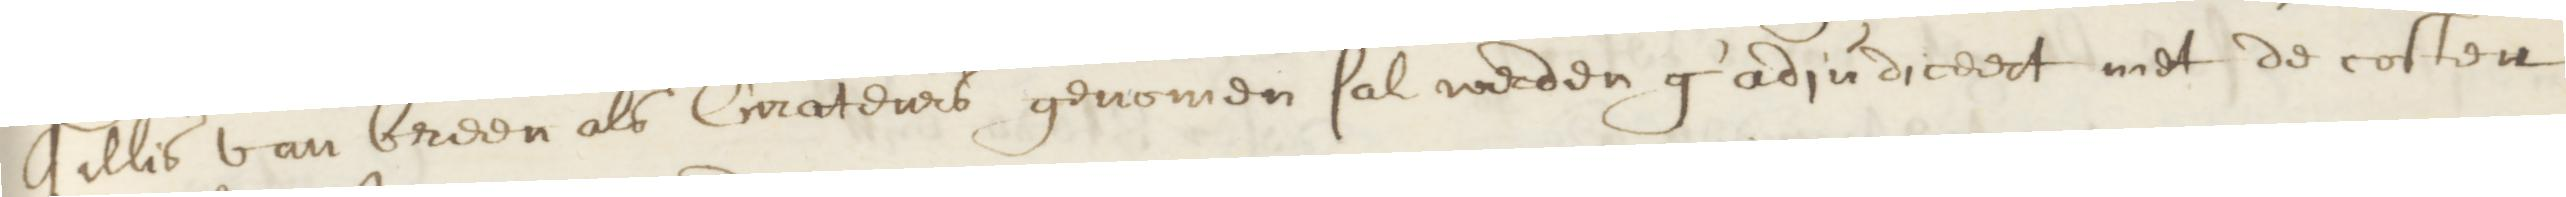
Gillis van breen als Curateurs genomen sal werden g’adjudiceert met de costen
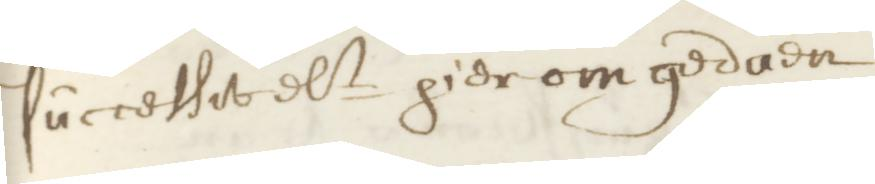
successivelijk hier om gedaen
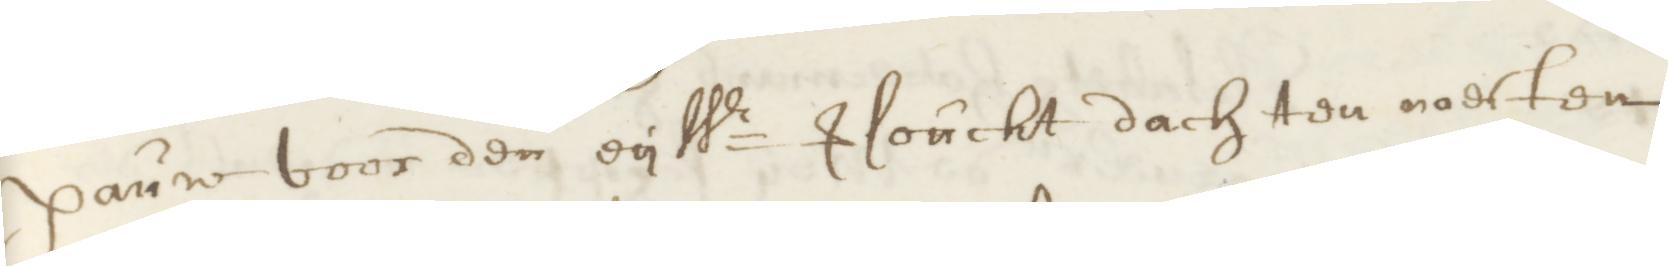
pauw voor den eijss=r versouckt dach ten naesten
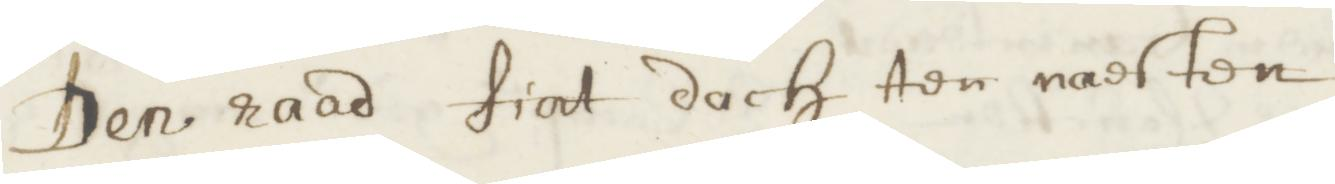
Den raad fiat dach ten naesten
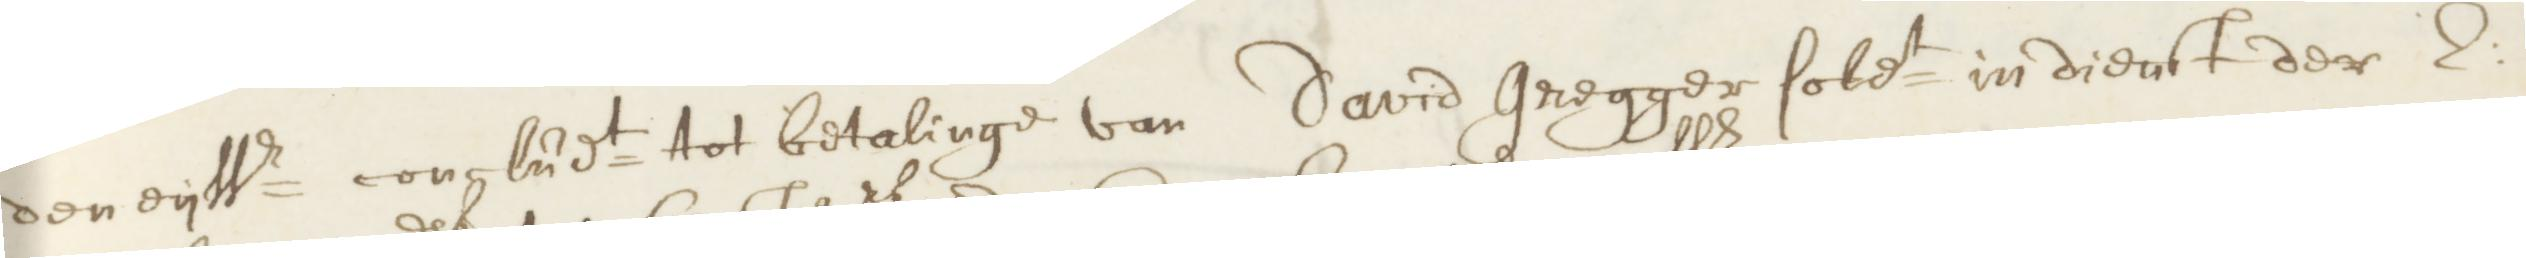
den eijss=r conclud=t tot betalinge van David Gregger sold=t in dienst der 2:
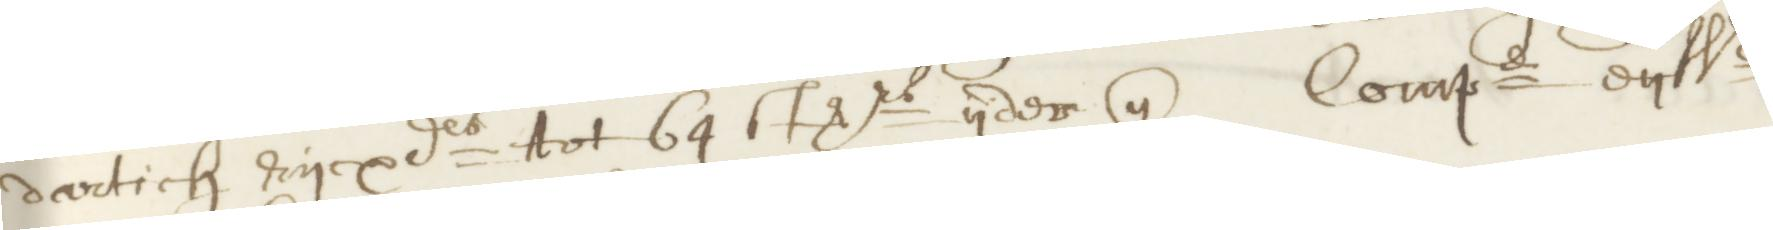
dartich rijcxd=rs tot 64 stver=rs ijder ende Comp=e eyss=r
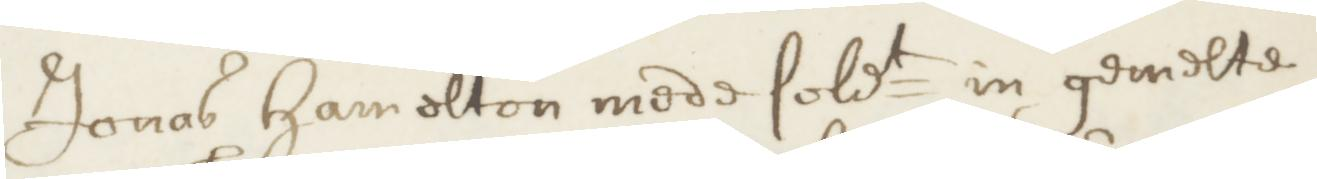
Jonas Hamelton mede sold=t in gemelte
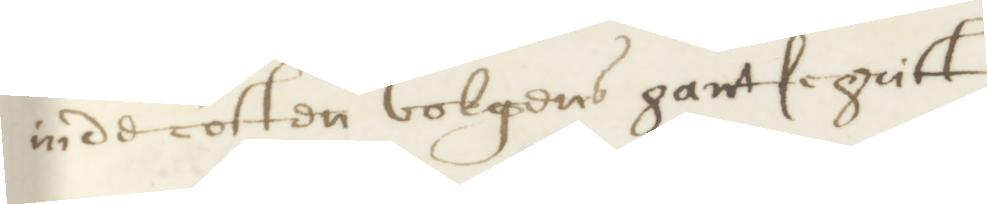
inde costen volgens hantschrift
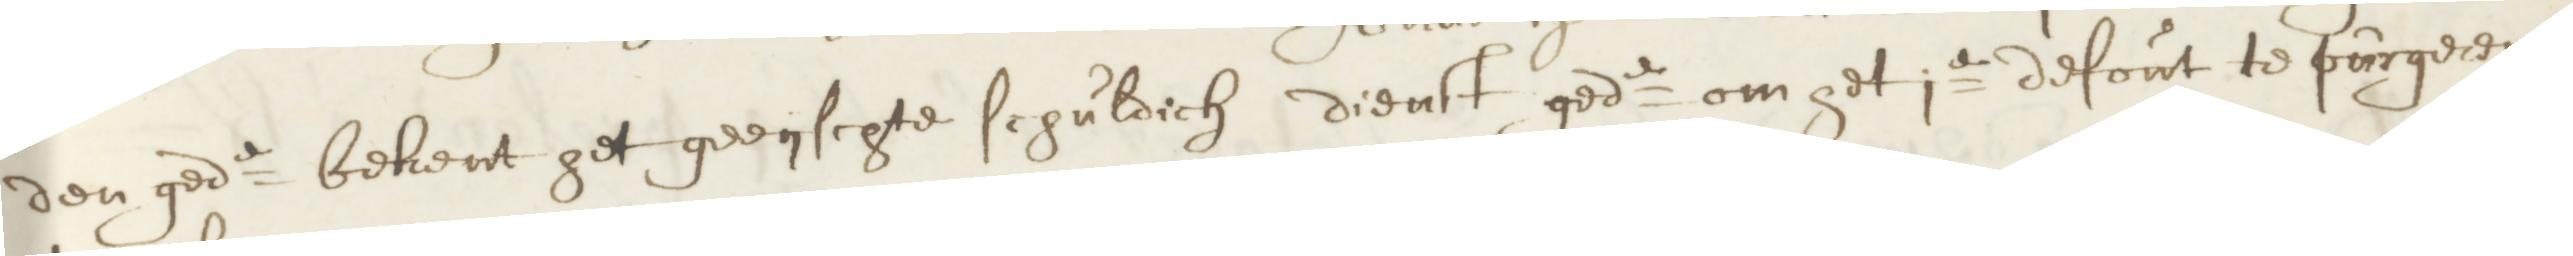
den ged=e bekent het geeijschte schuldich dienst ged=e om het j=e defout te purgeren
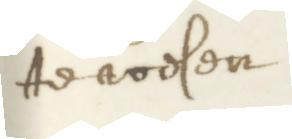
te wesen
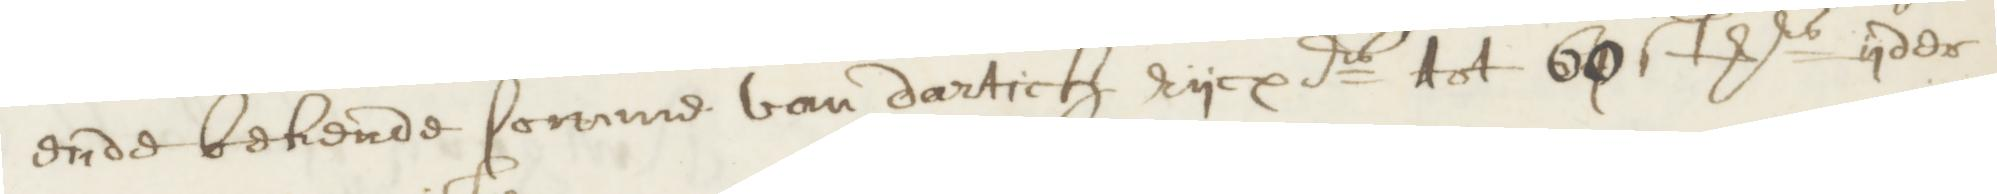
ende bekende somme van dartich rijcxd=rs tot 60 stver=rs ijder
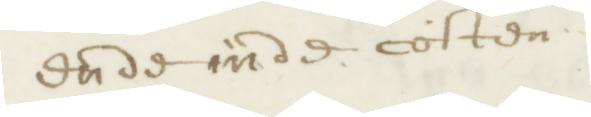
ende inde costen
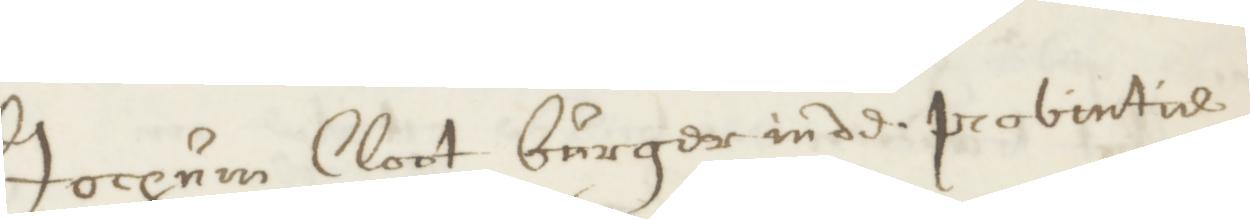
Jochum Cloot burger in de provintie
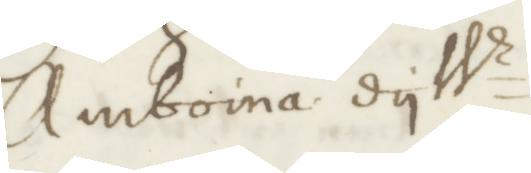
Amboina eijss=r
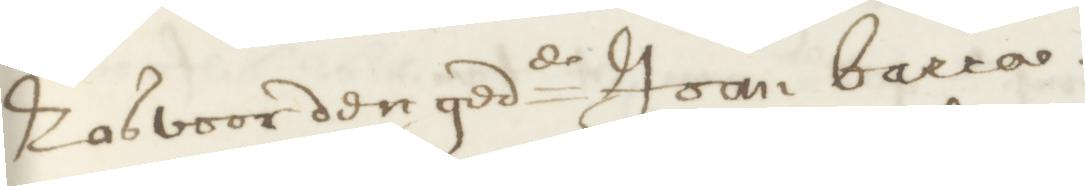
Zas voor den ged=e Joan barca —
